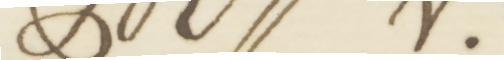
Fol„s 1.
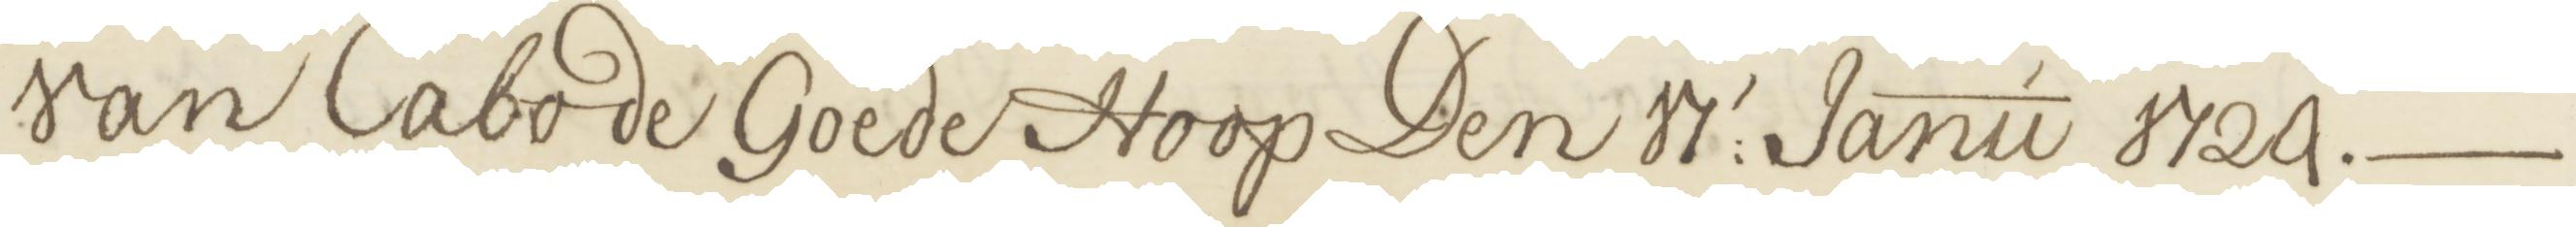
van Cabo de Goede Hoop Den 17:' Ianu 1724. —
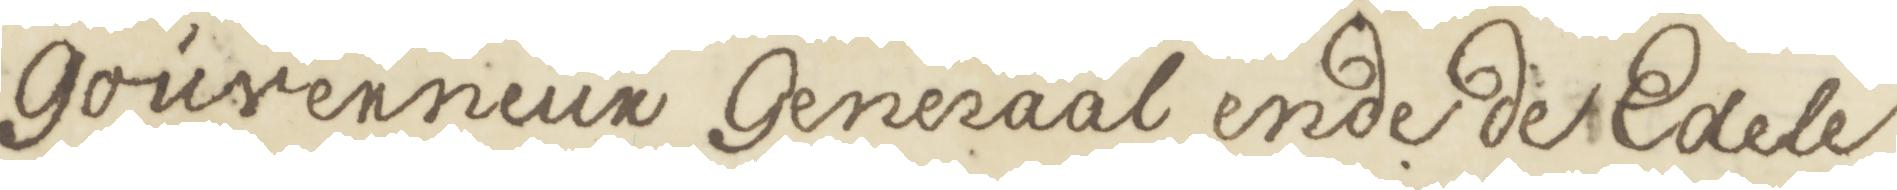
gouverneur Generaal ende de Edele
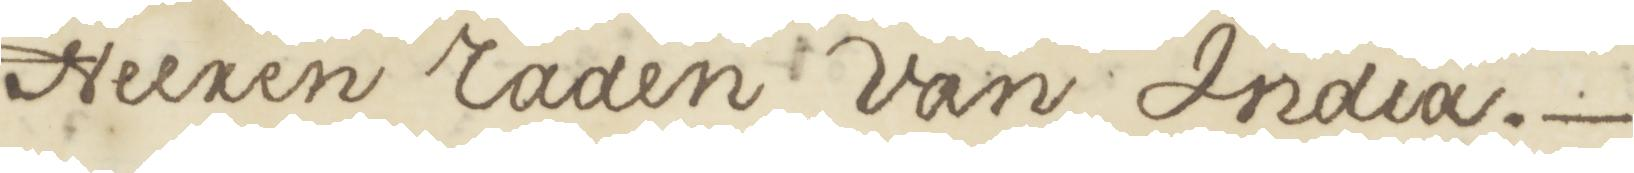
Heeren raden van India. —
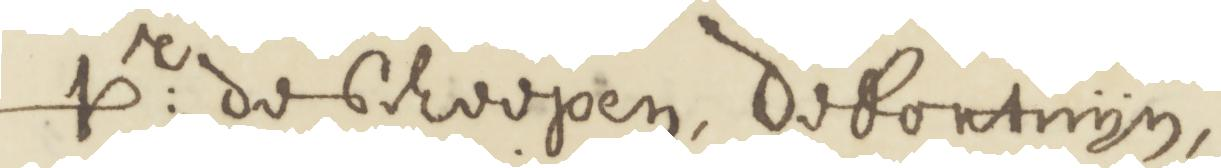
p:r de scheepen, defortuijn,
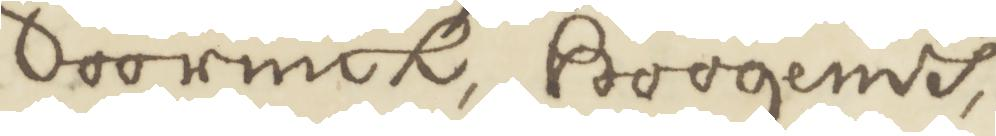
doornick, hoogenes,
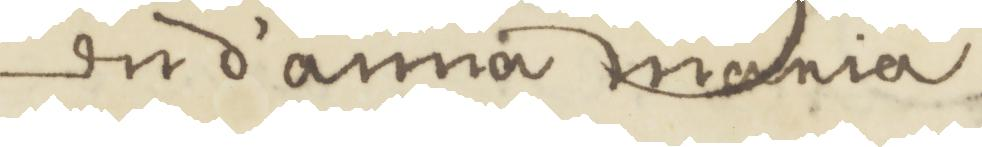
en d'anna maria
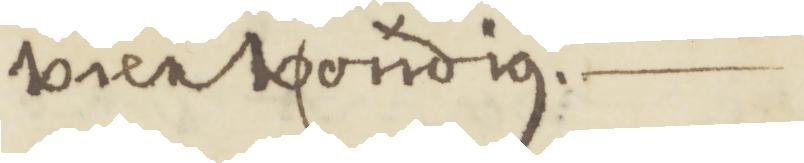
viervoudig. —
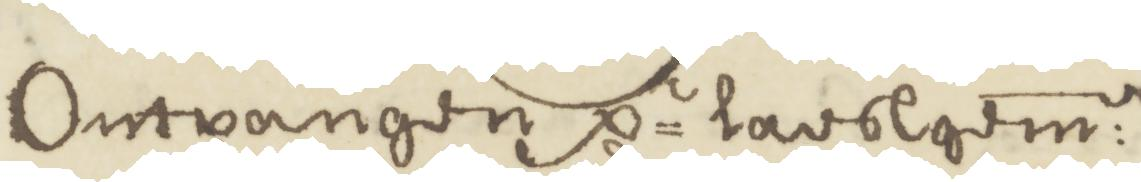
Ontvangen p=r laestgem:e
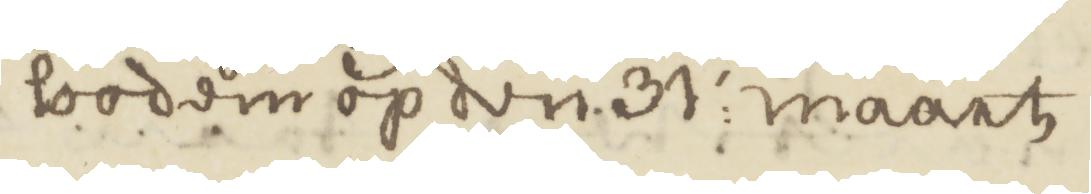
bodem op den 31:' maart
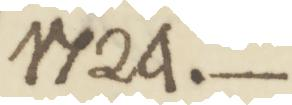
1724. —
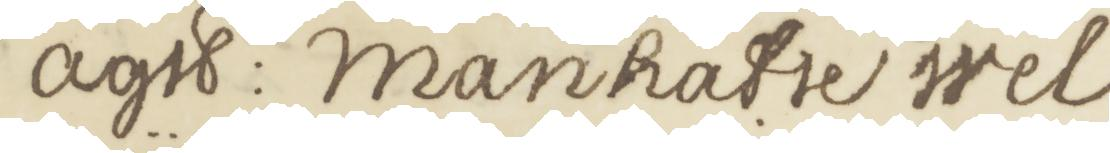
agtb: manhafte wel
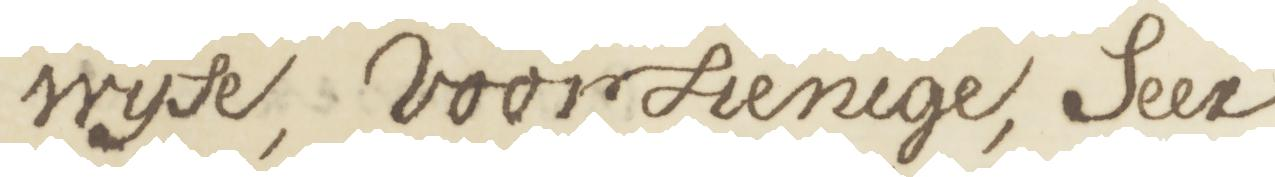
wijse, voorsienige, seer
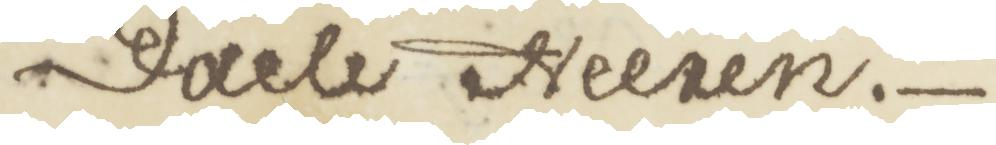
Edele Heeren. —
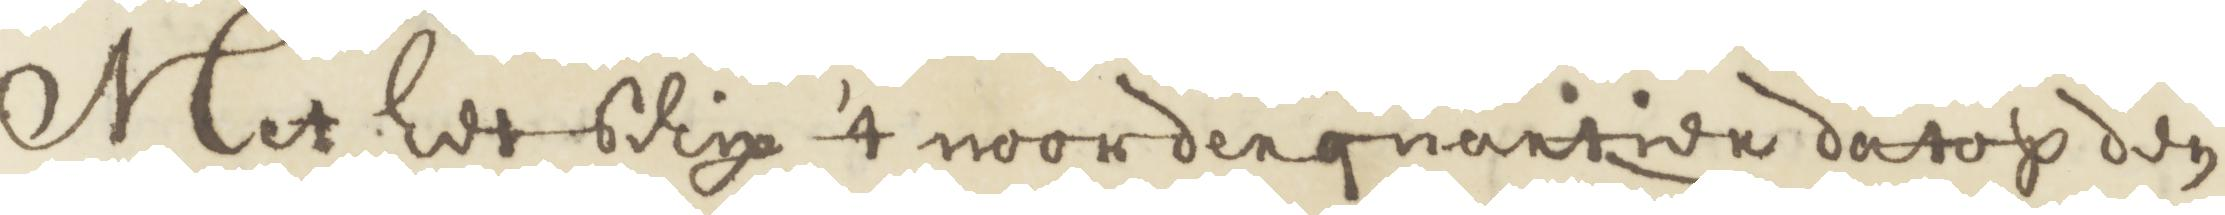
Met het schip ’t noorderquartier datop den
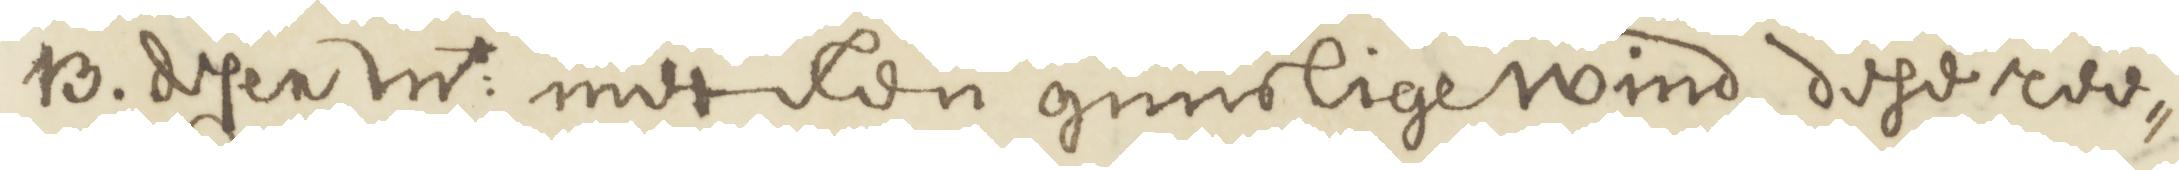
13. deser m:t met Een gunstige wind, dese ree„
